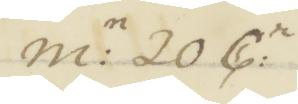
m:n 20 C:r
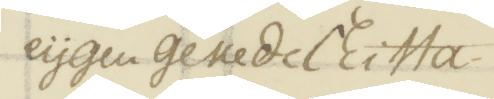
eijgen gerede Chitta
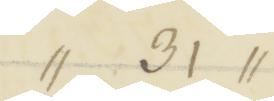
„ 31 „
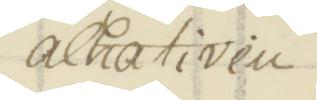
alkativen
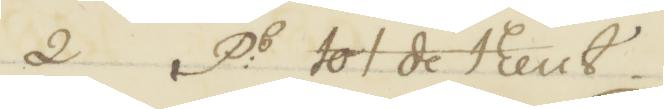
2 P:s tot de thens
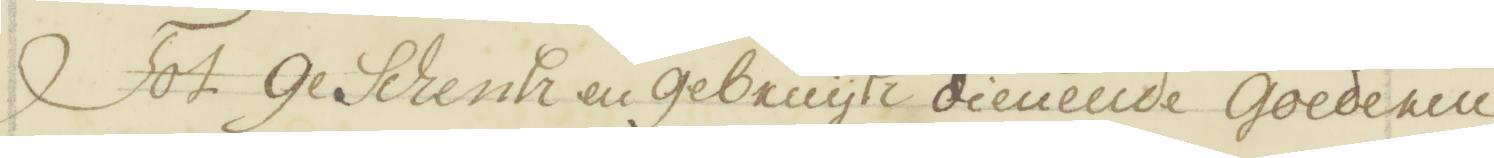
Tot geschenk en gebruijk dienende goederen
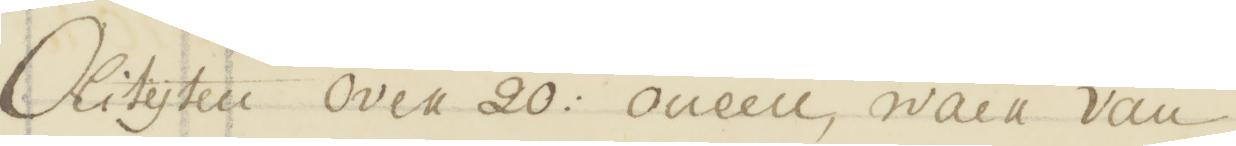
Olitijten over 20: oncen, waer van
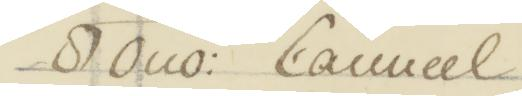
8 ono: Canneel
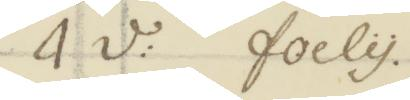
4 d:o foelij.
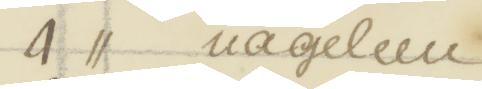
4 „ nageleen
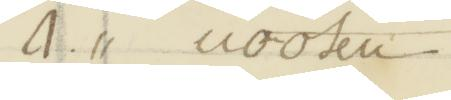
4. „ nooten
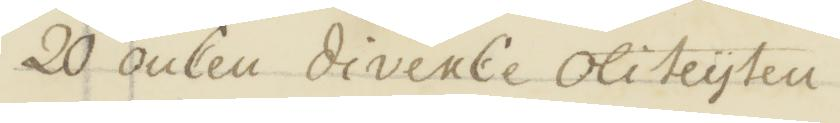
20 oncen diverce oliteijten
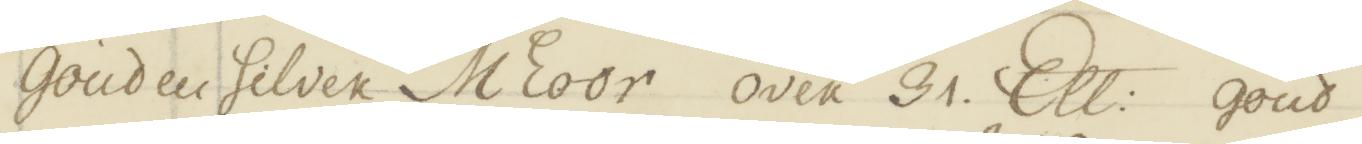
goud er silver Mhoor over 31. Ell: goud
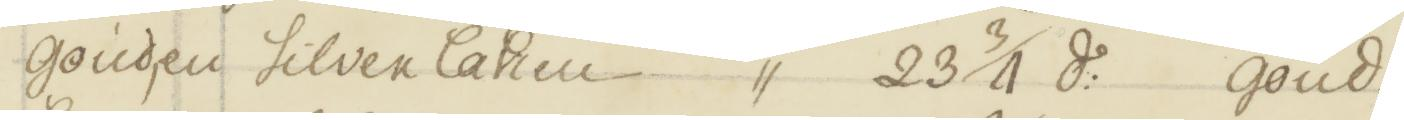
goud, en silver laken „ 23¾ d:o goud.
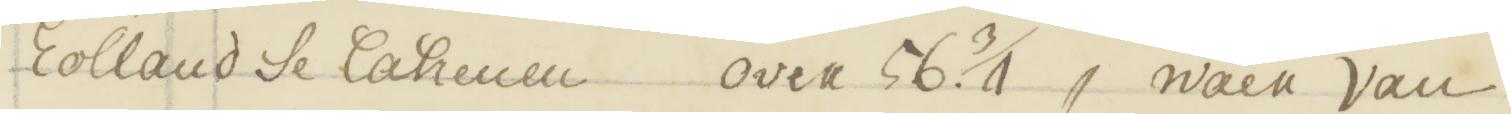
hollandse lakenen over 56.¾ „ waer van
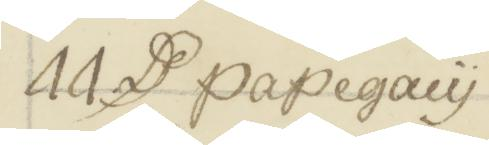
44 Ps papegaeij
